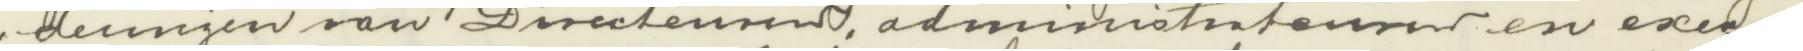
deringen van Directeuren, administrateuren en execu
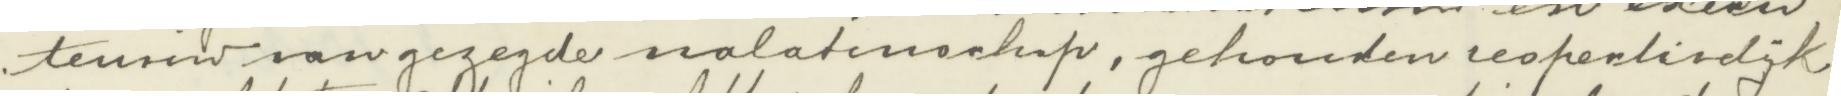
„teurie van gezegde nalatenschap, gehouden respectivelijk
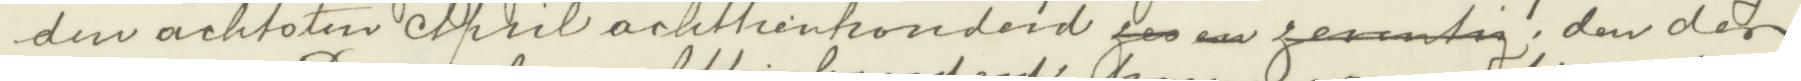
den achtsten April achttienhonderd zes en zeventig, den der
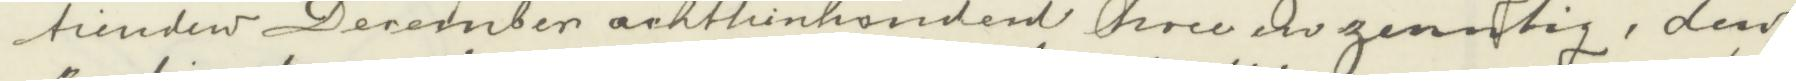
tienden December achttienhonderd twee en zeventig, den
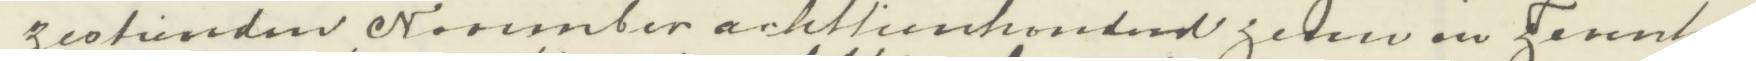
zestienden November achttienhonderd zeven en zeventig
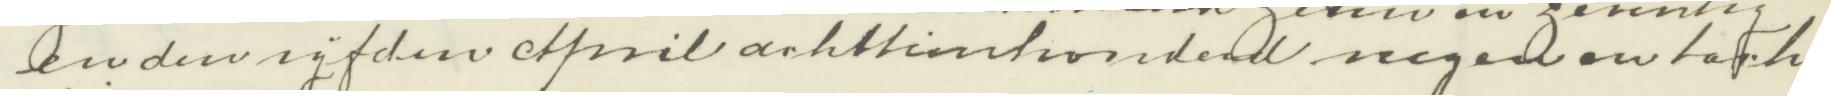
en den vijfden April achttienhonderd negen en tach
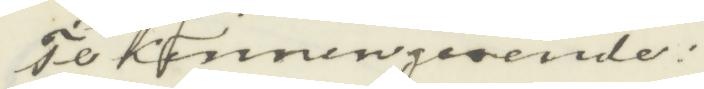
Te kennen gevende.
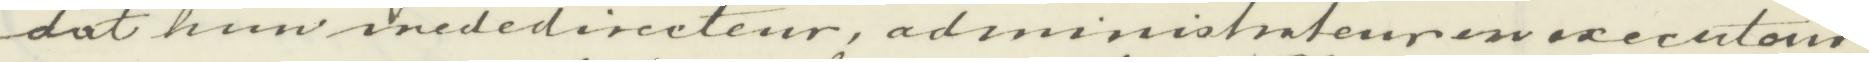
dat hun mededirecteur, administateur en executeur
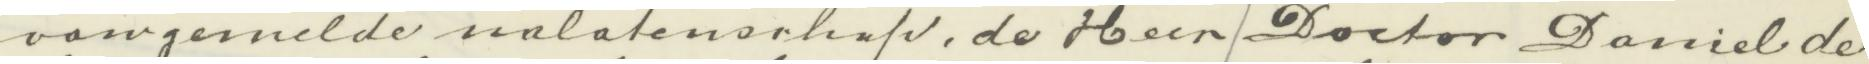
van gemelde nalatenschap, de Heer Doctor Daniel de
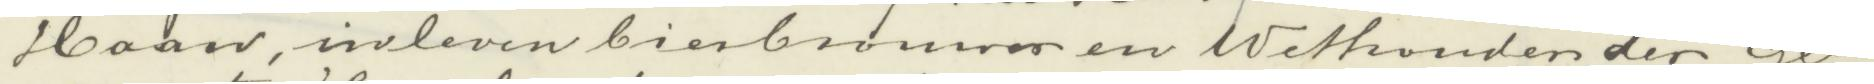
Haan, in leven bierbrouwer en Wethouder der Ge
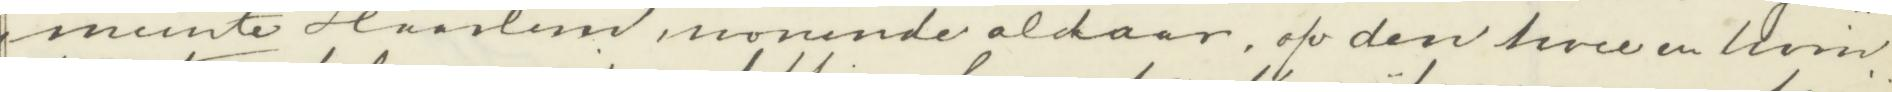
meente Haarlem, wonende aldaar, op den twee en twin
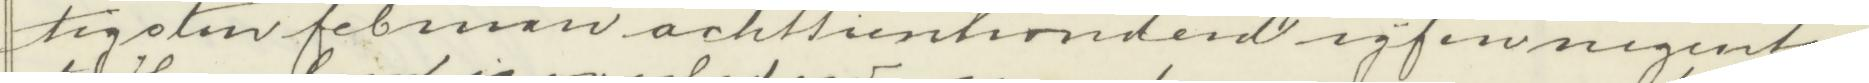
tigsten februari achttienhonderd vijf en negentig
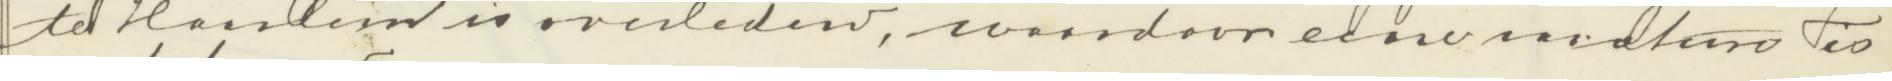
te Haarlem is overleden, waardoor eene vacature is
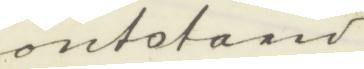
ontstaan
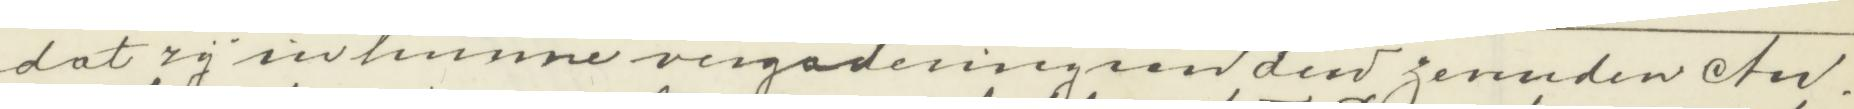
dat zij in hunne vergaderingeen den zevenden Au
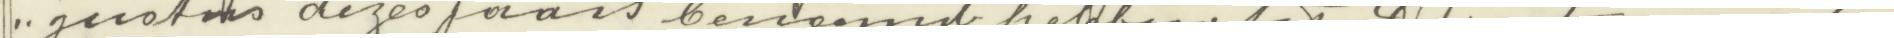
„gustus dezes jaars benoemd hebben tot Directeur, ad
